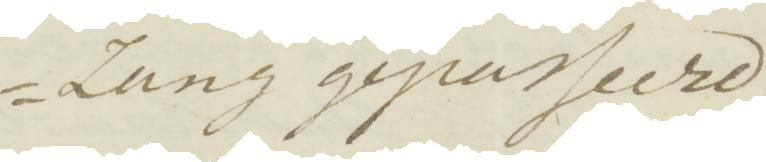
=zang gepasseerd
